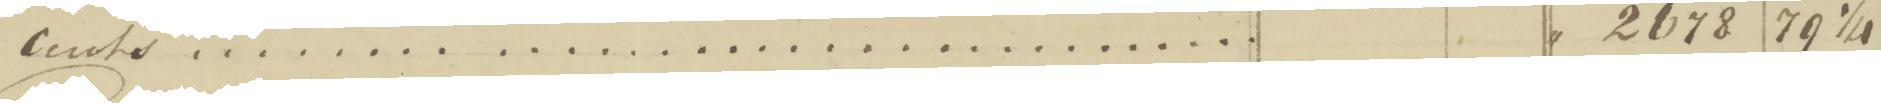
Cents. . . . . . . . . . . . . . . . . . . . . . . . . . . . . . . . . . . „ 2678 79¼
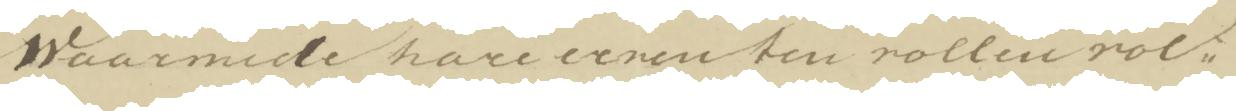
Waarmede hare erven ten vollen vol„
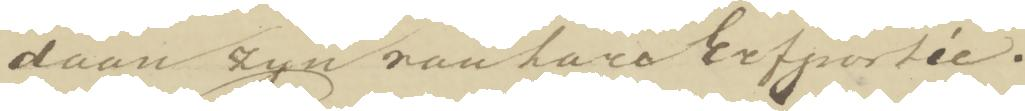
daan zyn van hare Erfportie.
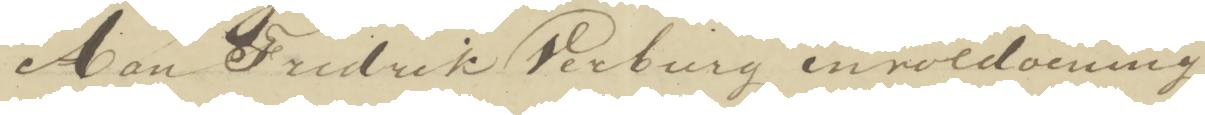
Aan Fridrik Verburg in voldoening
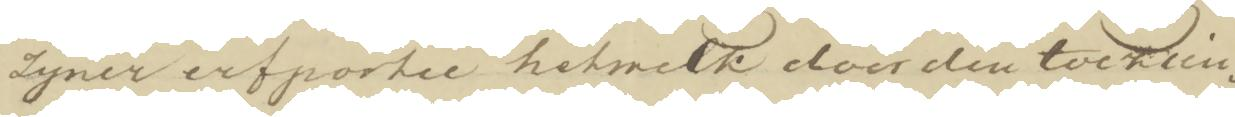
zyner erfportie hetwelk door den toezien
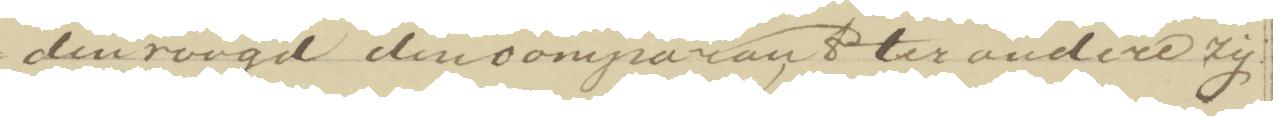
den voogd den comparant ter andere zij
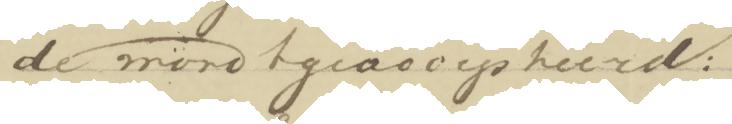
de wordt geäccepteerd:
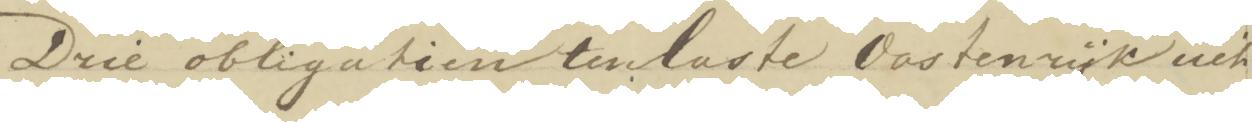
Drie obligatien ten laste Oostenrijk uit
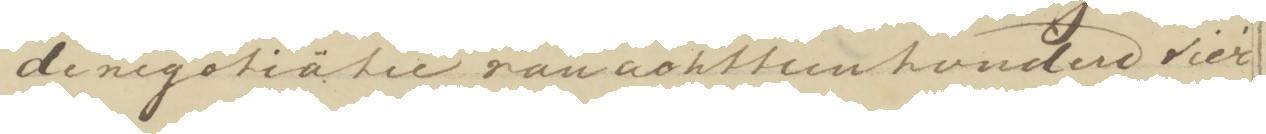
de negotiatie van achttienhonderd vier
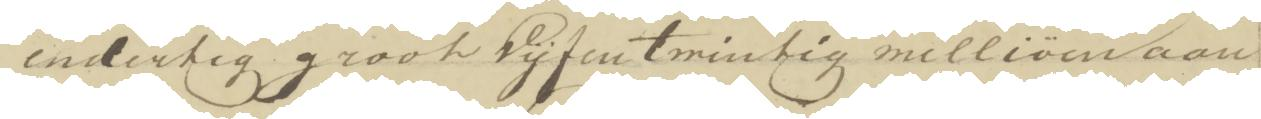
en dertig groot Vijf en twintig milliöen aan
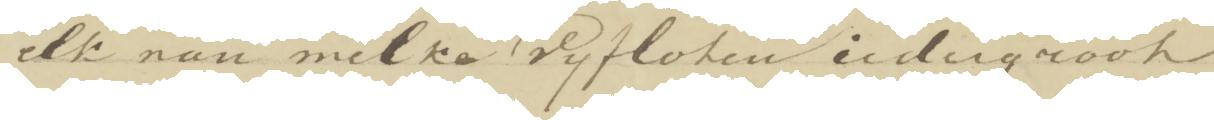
elk van welke vyf loten ieder groot
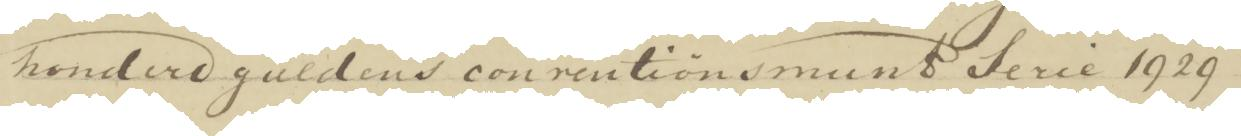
honderd guldens conventiöns munt Serie 1929
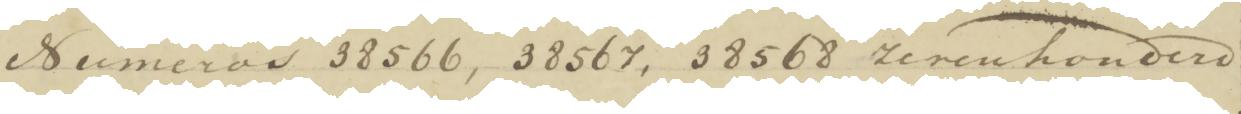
Numero's 38566, 38567, 38568 zevenhonderd
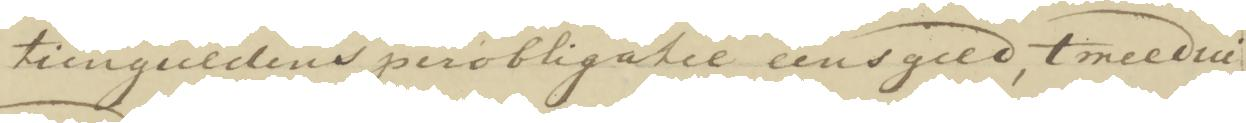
tien guldens per obligatie eens geld, tweedui
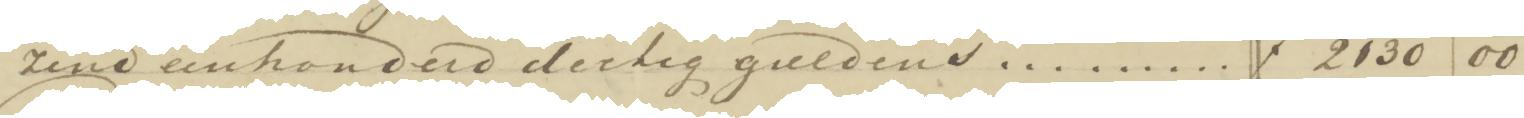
zend een honderd dertig guldens. . . . . . . . .ƒ 2130 00
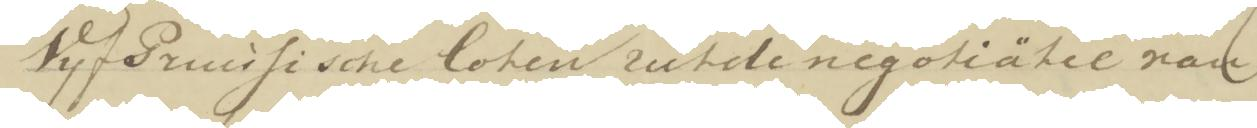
Vyf Pruissische loten uit de negotiätie van
